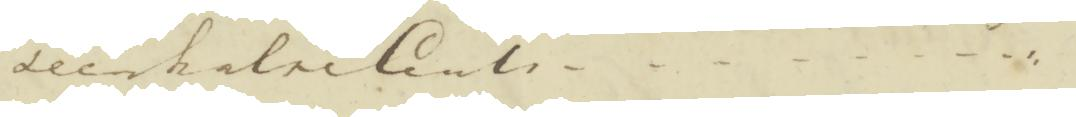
& een halve Cents „
